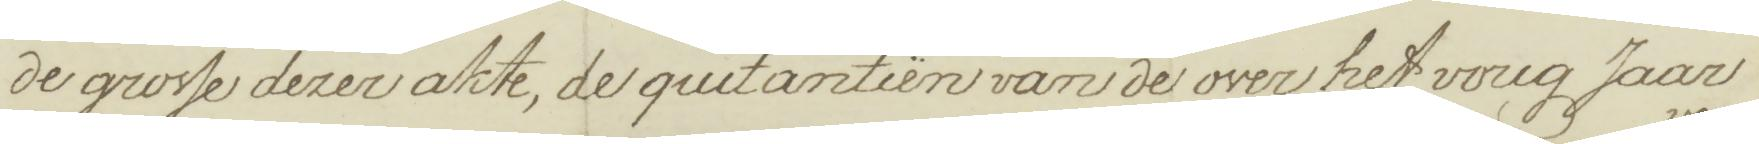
de grosse dezer akte, de quitantien van de over het vorig Jaar
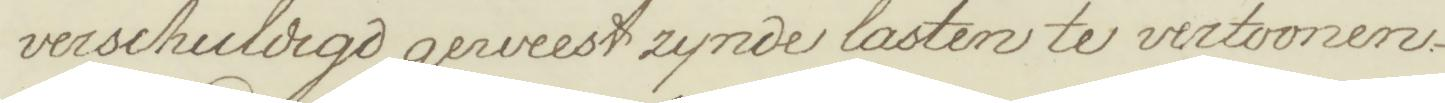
verschuldigd geweest zynde lasten te vertoonen.
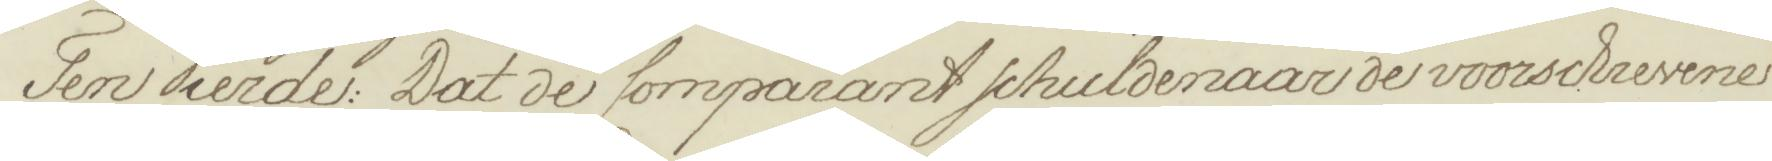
Ten Vierde: Dat de Comparant schuldenaar de voorschrevene
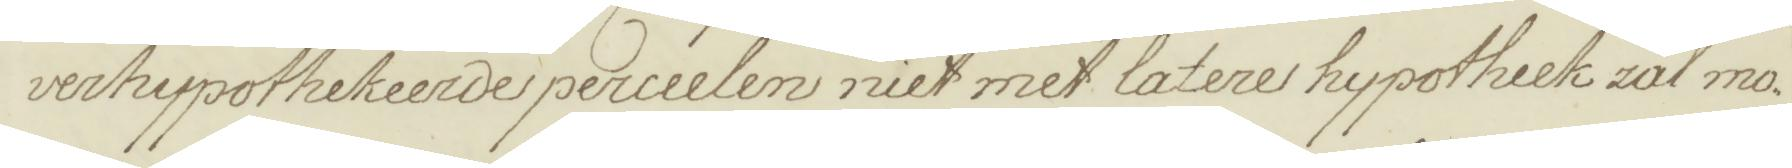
verhypothekeerde perceelen niet met latere hypotheek zal mo„
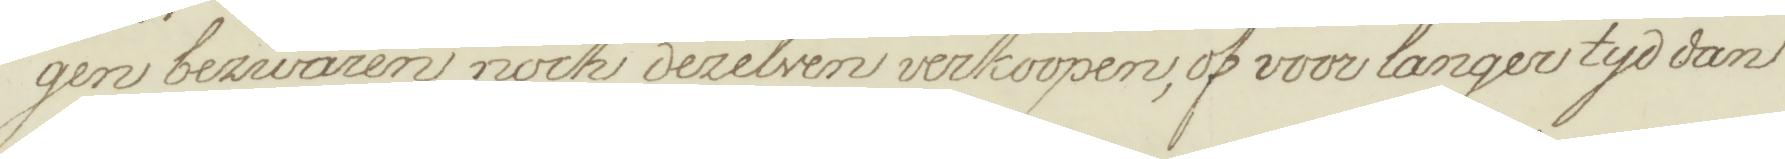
gen bezwaren noch dezelven verkoopen, of voor langer tyd dan
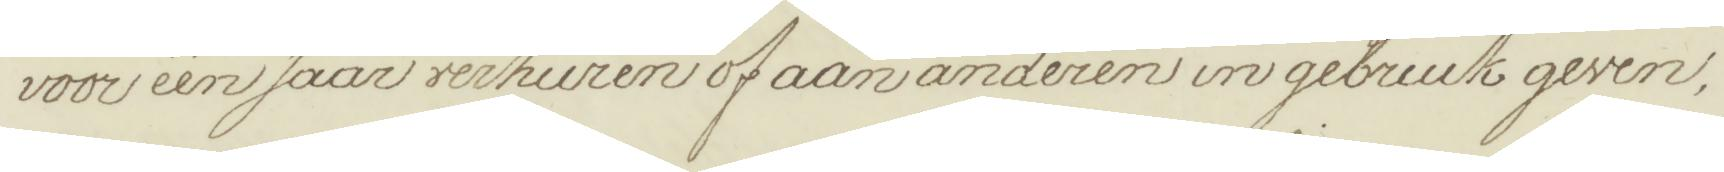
voor één Jaar verhuren of aan anderen in gebruik geven,
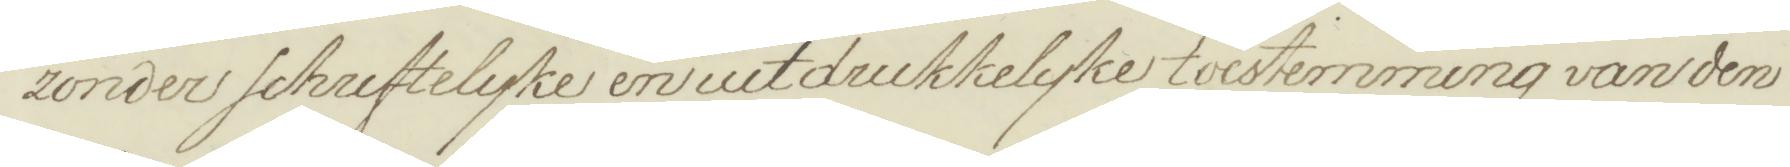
zonder Schriftelyke en uitdrukkelyke toestemming van den
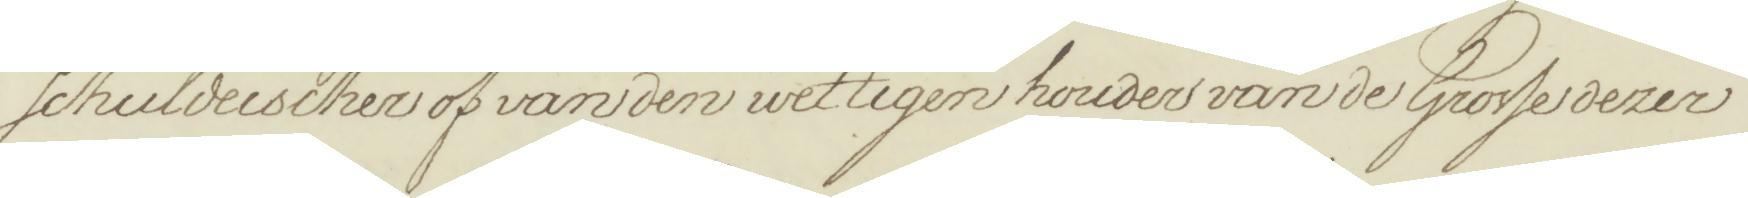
Schuldeischer of van den wettigen houder van de Grosse dezer
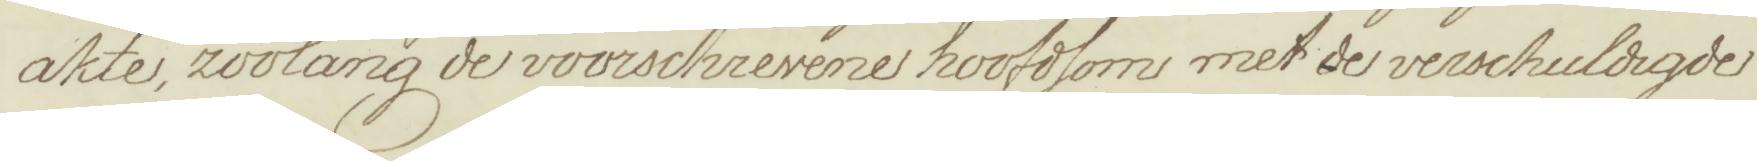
akte, zoolang de voorschrevene hoofdsom met de verschuldigde
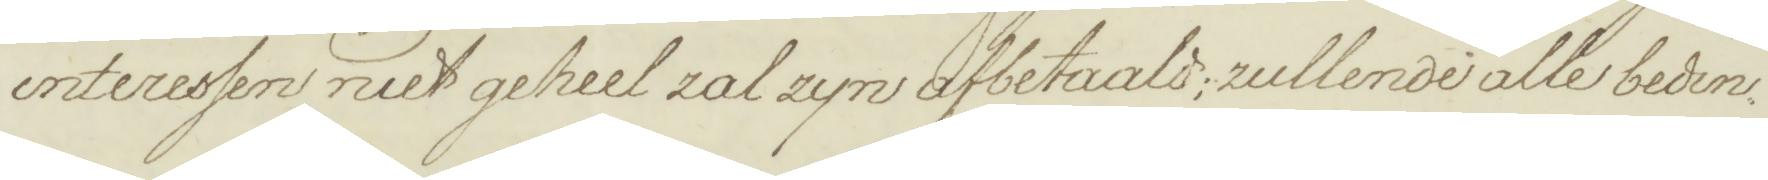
interessen niet geheel zal zyn afbetaald, zullende alle bedin„
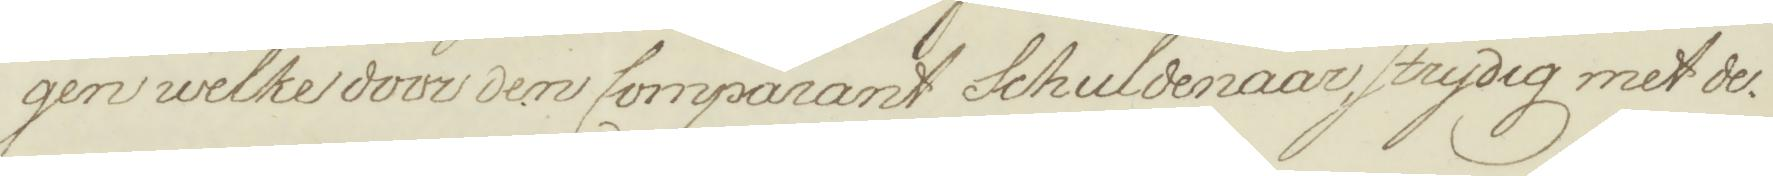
gen welke door den Comparant Schuldenaar Strydig met de„
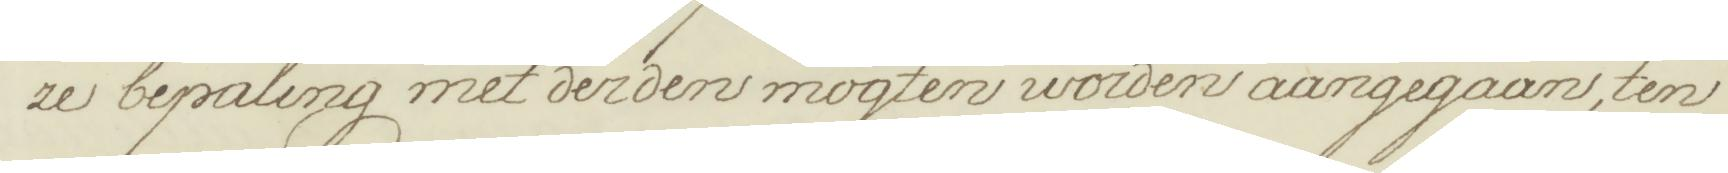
ze bepaling met derden mogten worden aangegaan, ten
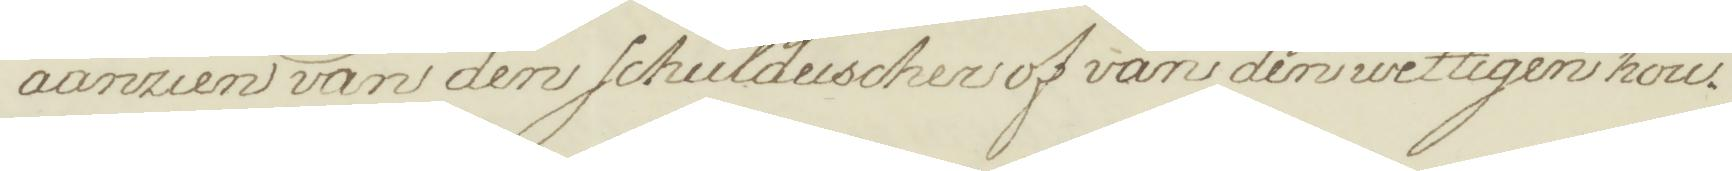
aanzien van den Schuldeischer op van den wettigen hou„
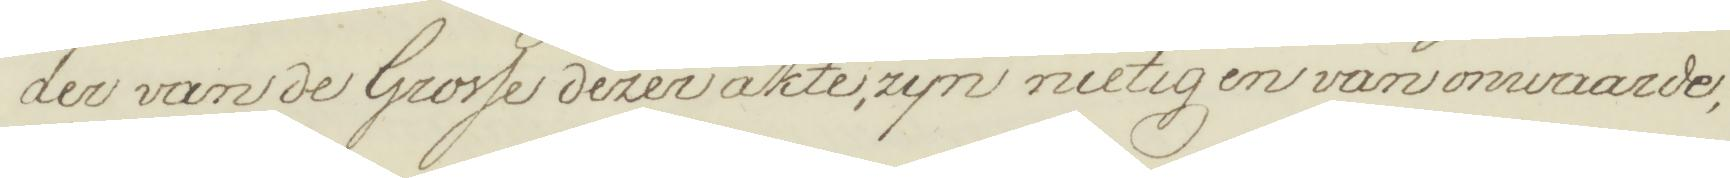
der van de Grosse dezer akte, zyn nietig en van onwaarde,
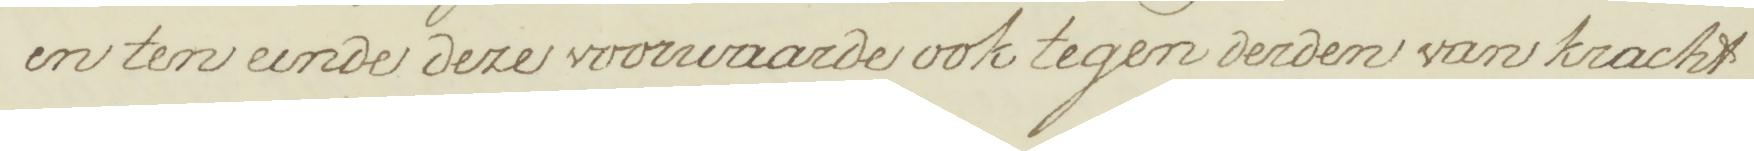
en ten einde deze voorwaarde ook tegen derden van kracht
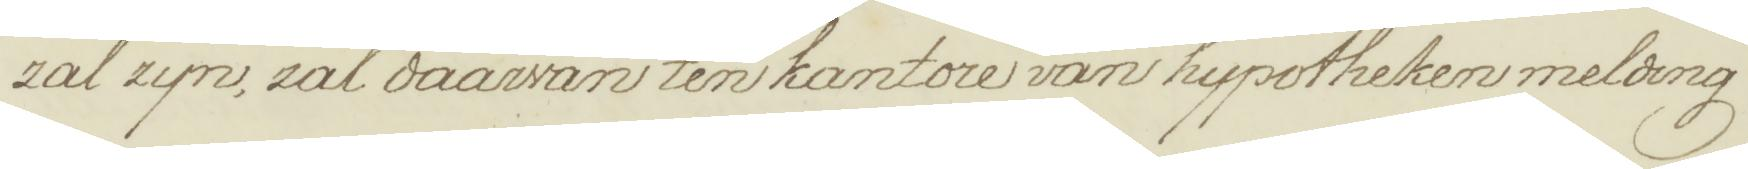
zal zyn, zal daarvan ten kantore van hypotheken melding
